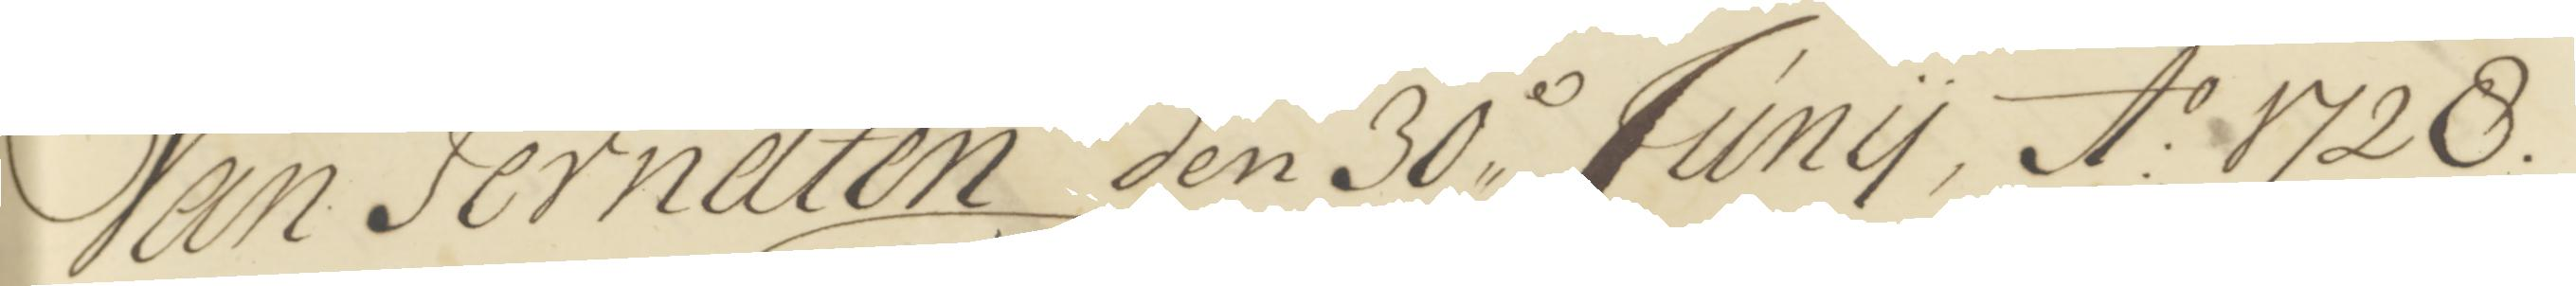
Van Ternaten den 30„e Junij, A:o 1728.
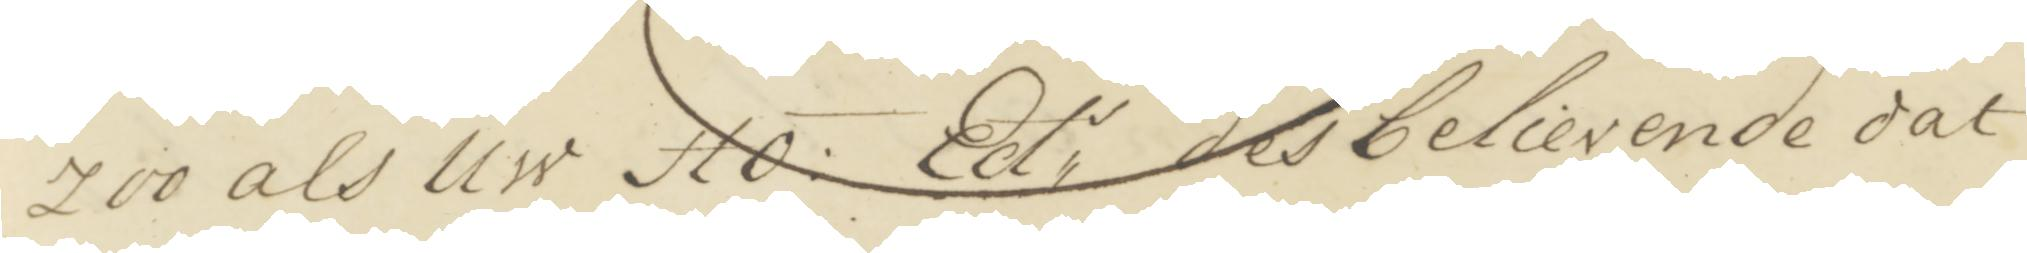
zoo als uw Ho: Ed„s des believende dat
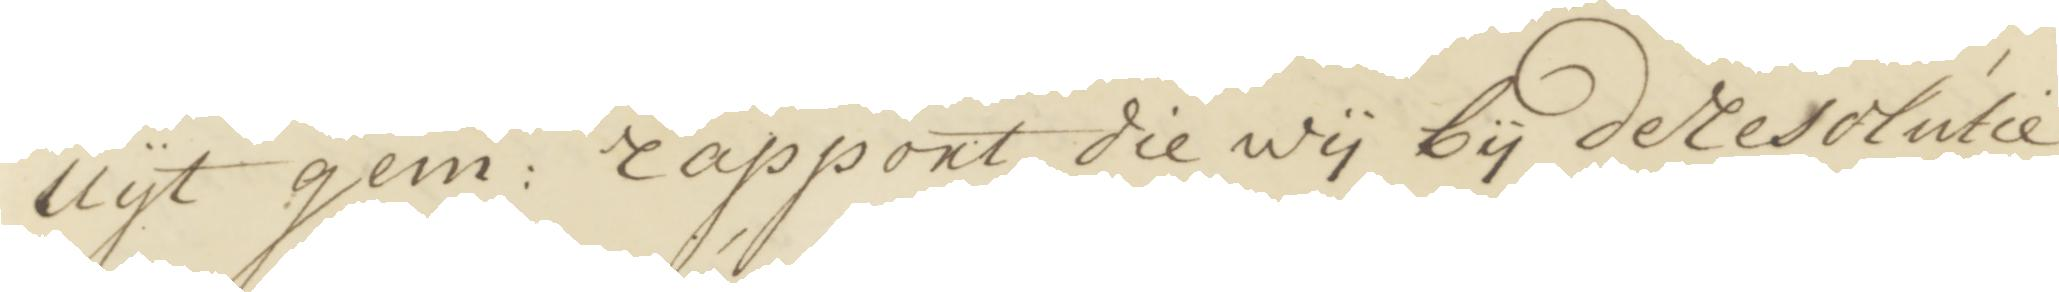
uijt gem: rapport die wij bij de Resolutie
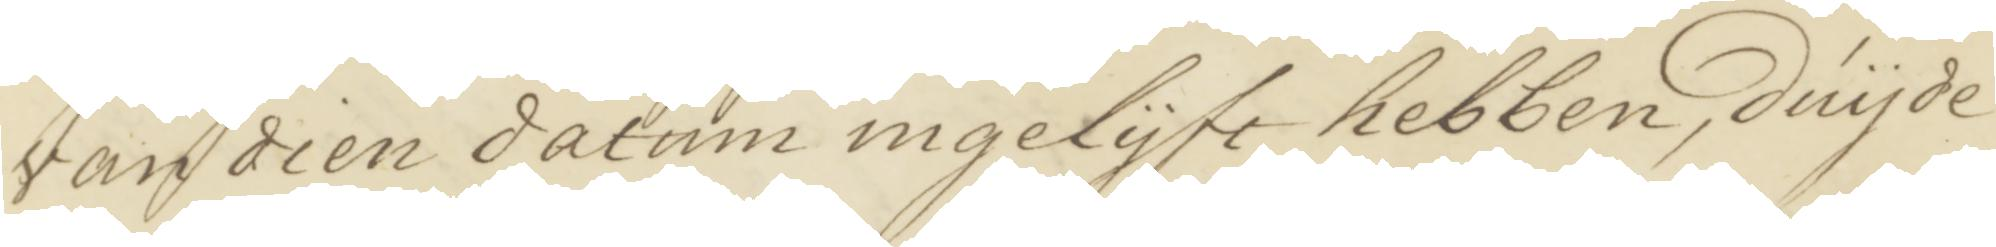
van dien datum ingelijft hebben, duijde
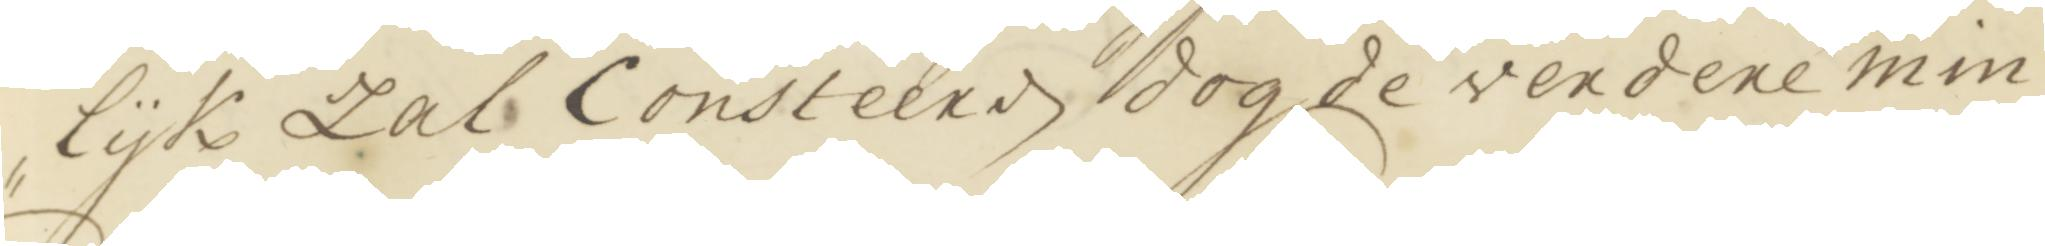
„lijk Zal Consteeren dog de verdere min
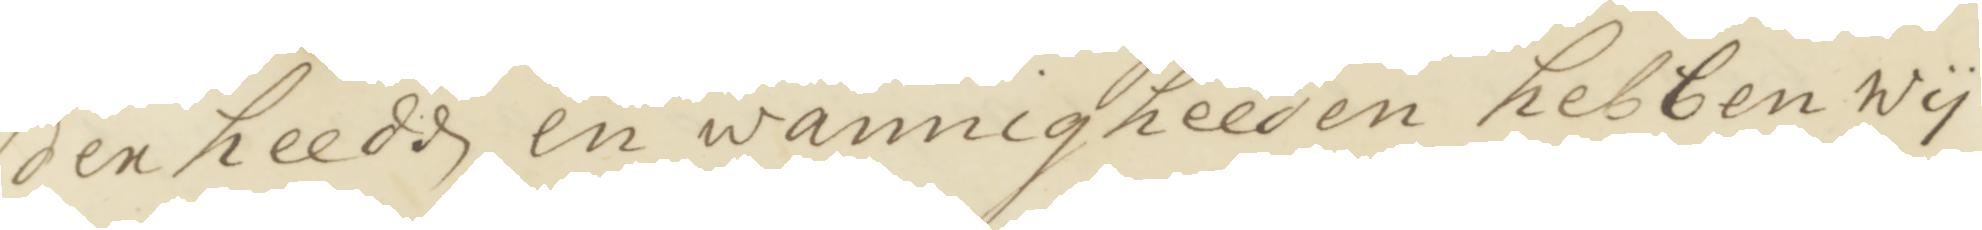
der heeden en wannigheeden hebben wij
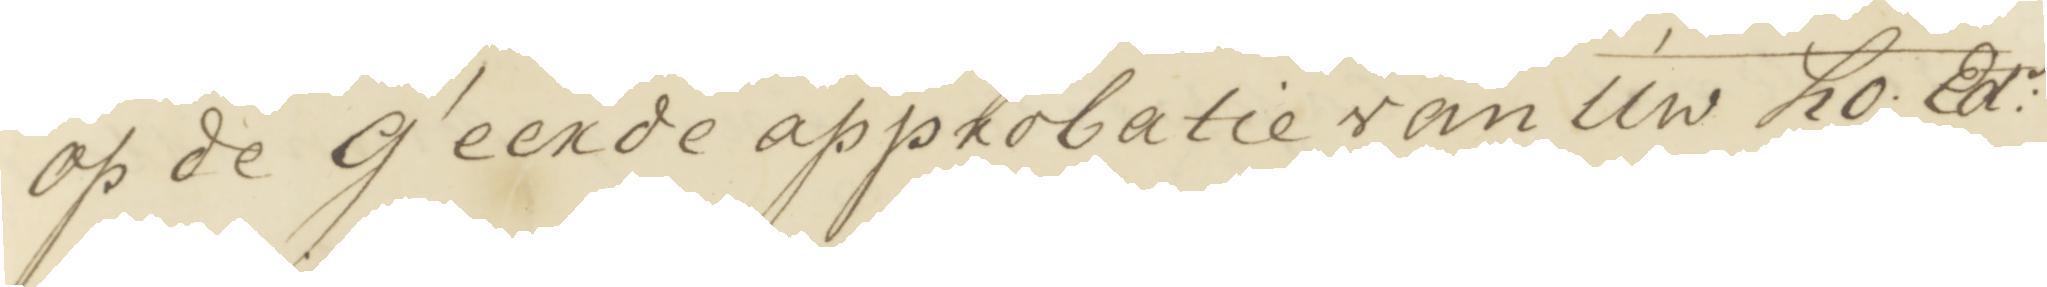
op de g’eerde approbatie van uw ho: Ed:s
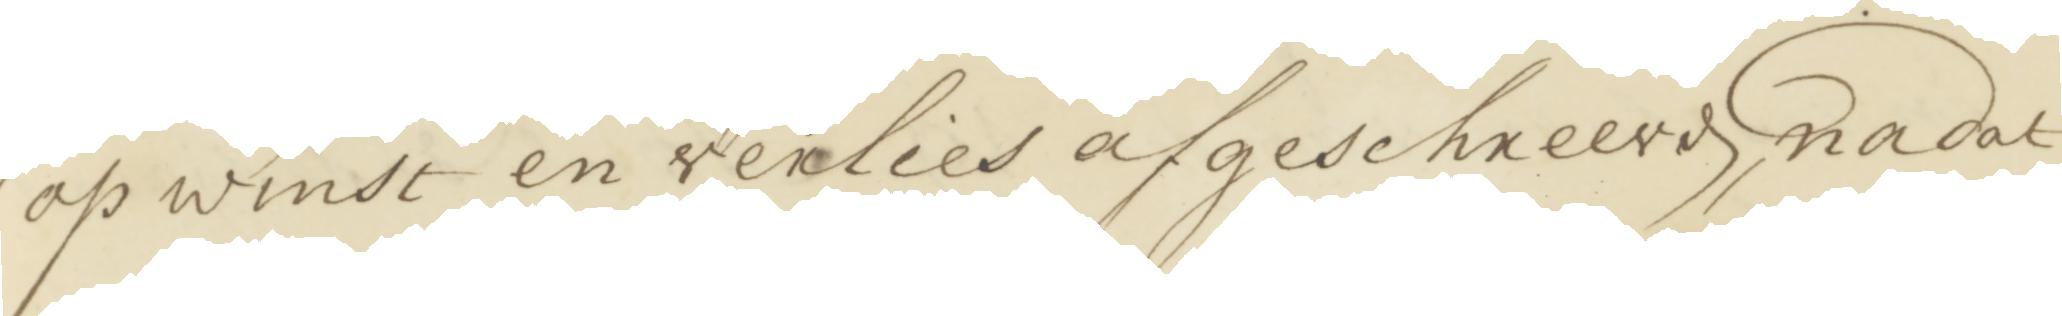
op winst en verlies afgeschreeven, nadat
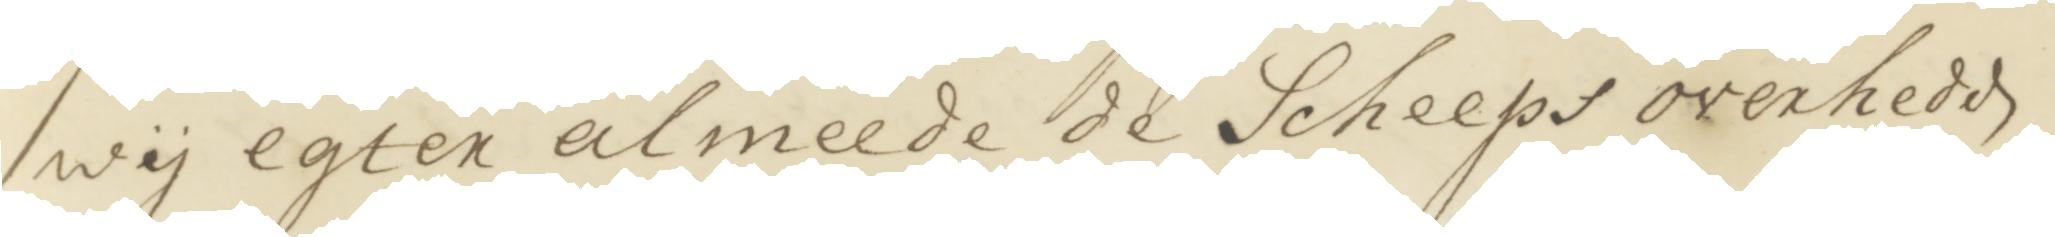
wij egter almeede de Scheeps overheden
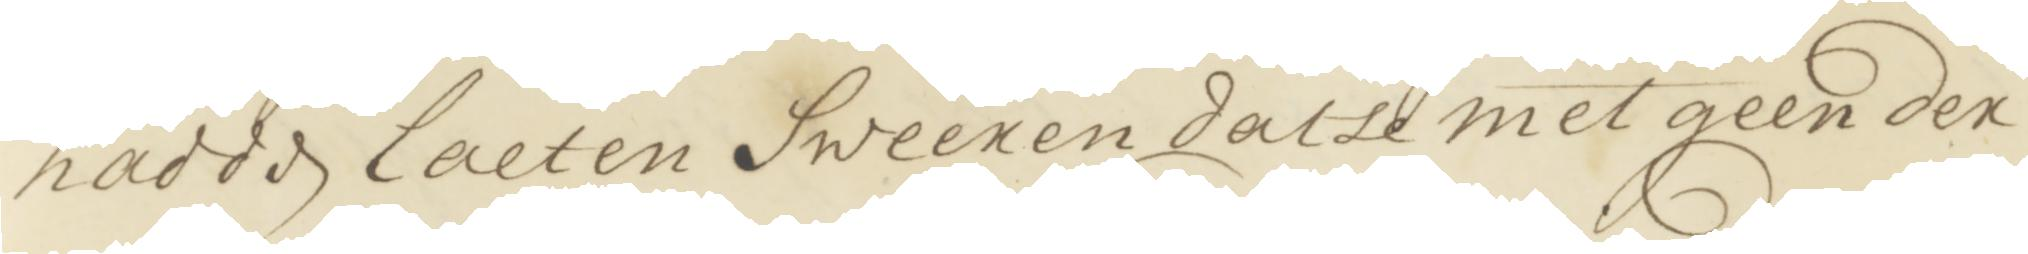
hadden laeten Sweeren datse met geen der
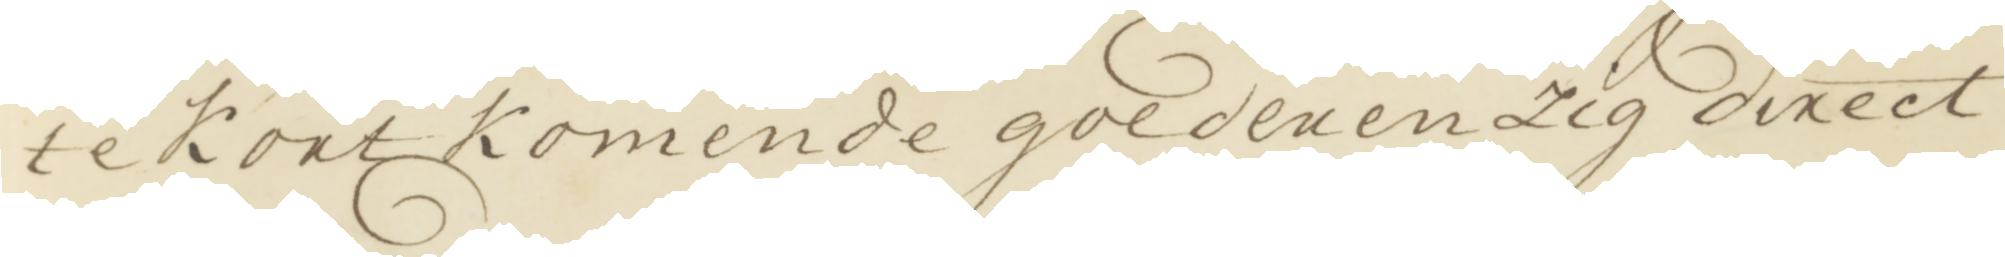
te kort komende goederen zig direct
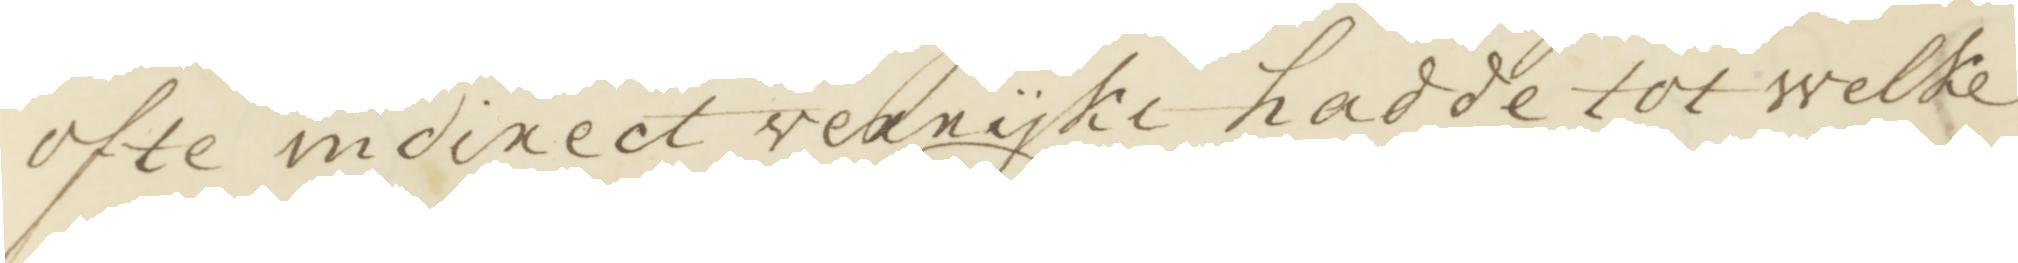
of te indirect verrijkt hadde tot welke
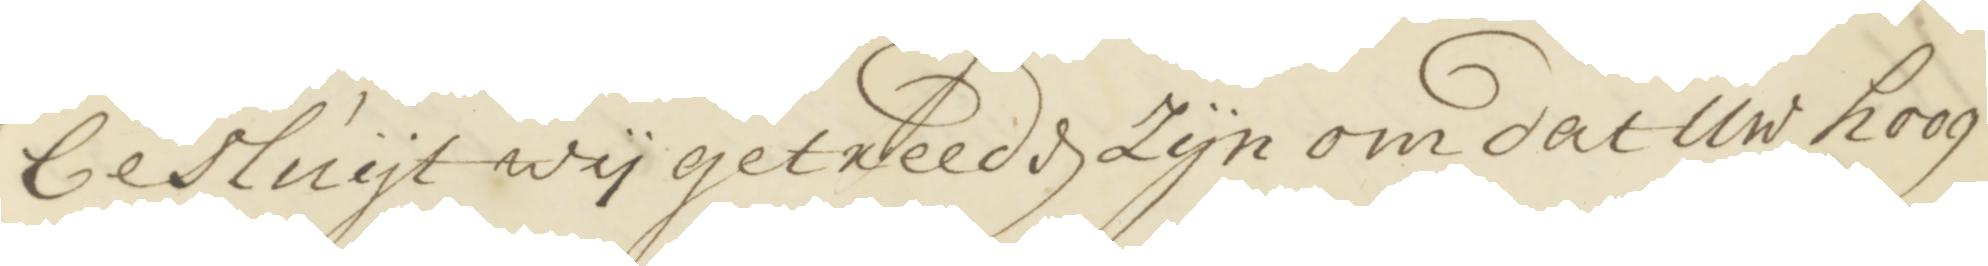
besluijt wij getreeden zijn om dat uw hoog
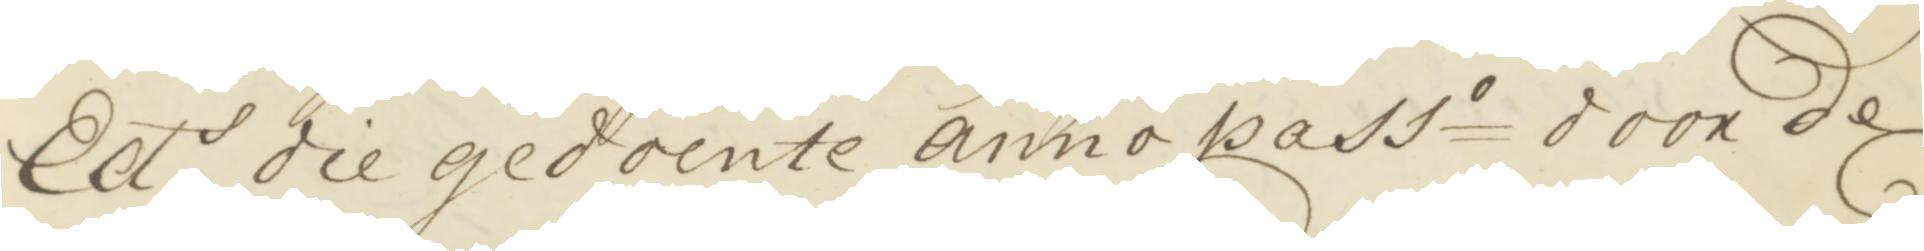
Ed:s die gedoente anno pass=o door de
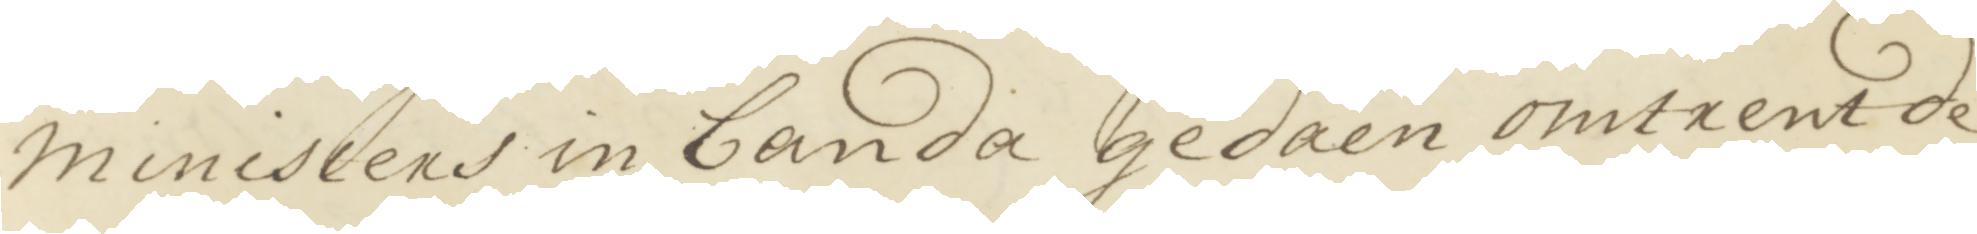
ministers in banda gedaen omtrent de
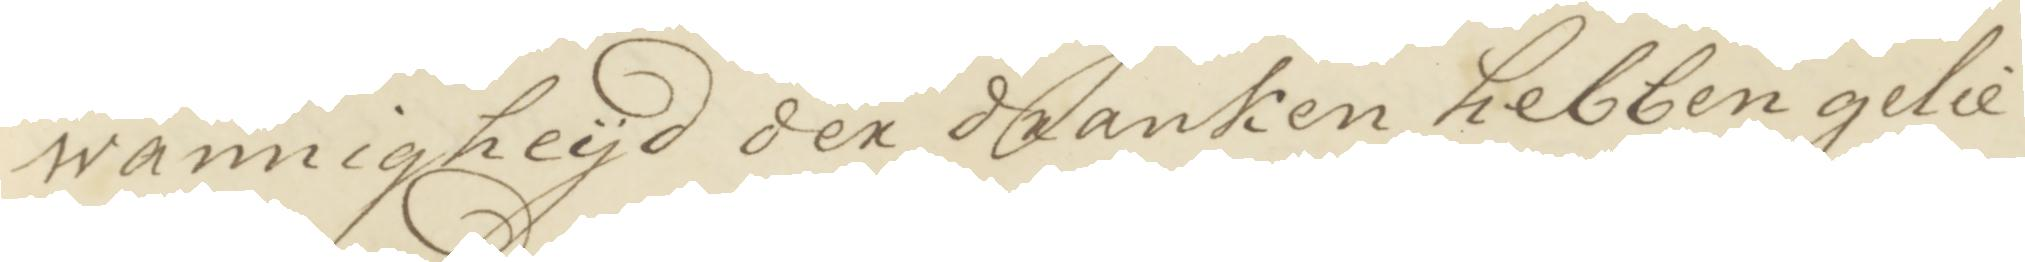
wannigheijd der dranken hebben gelie
